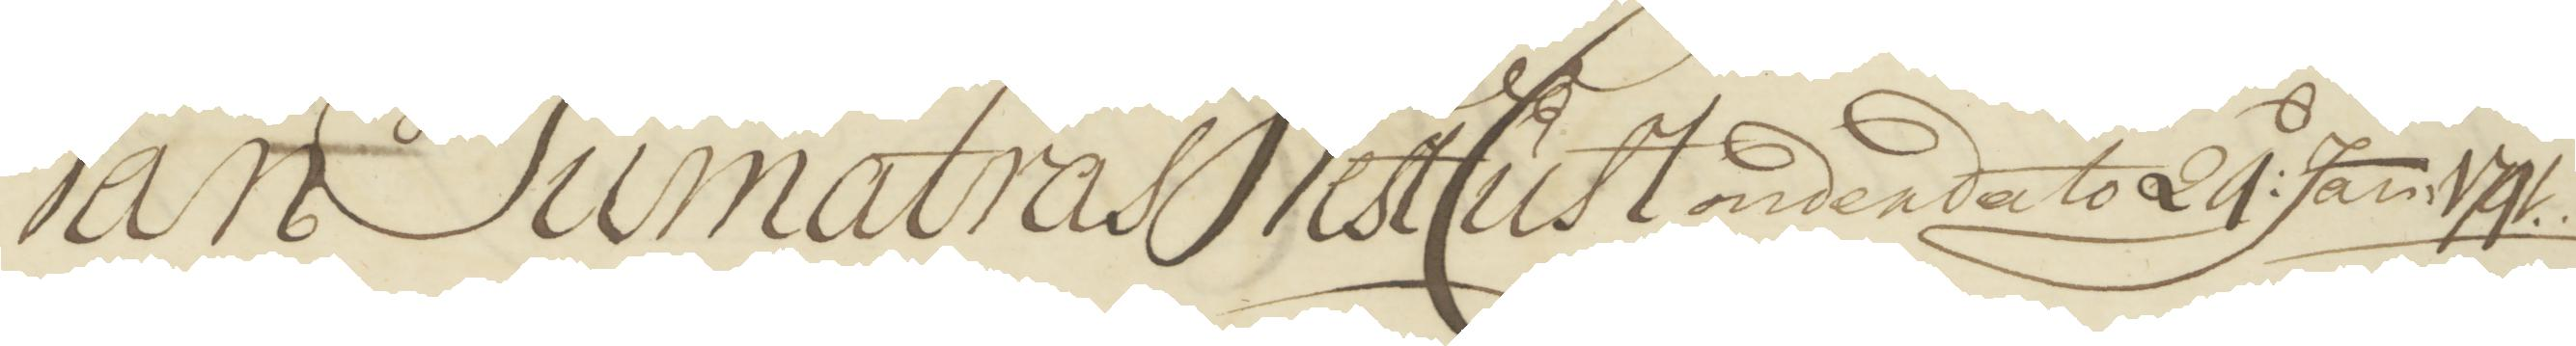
Van Sumatras West Cust onder dato 24:s Jan: 1741.
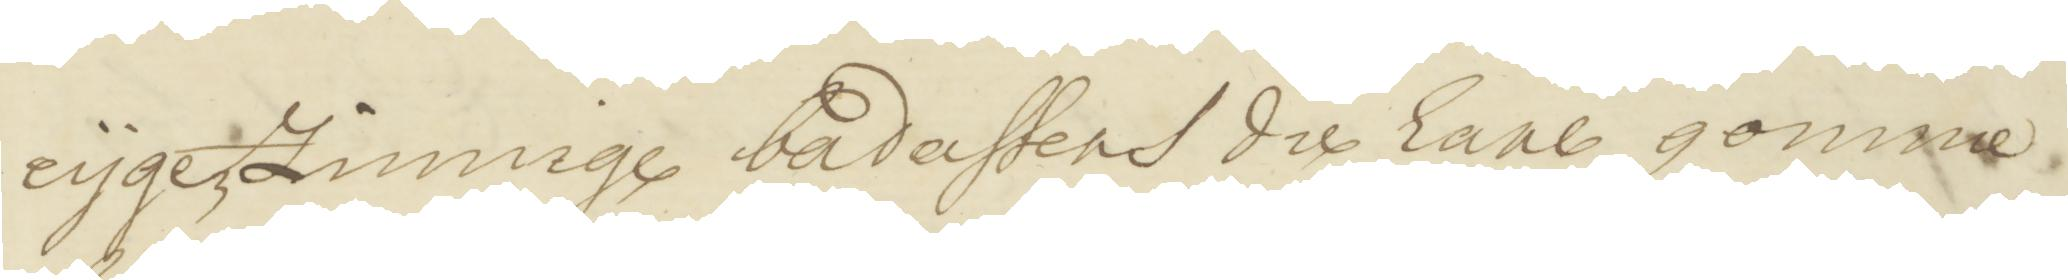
eijgen zinnige badassers die hare gomme
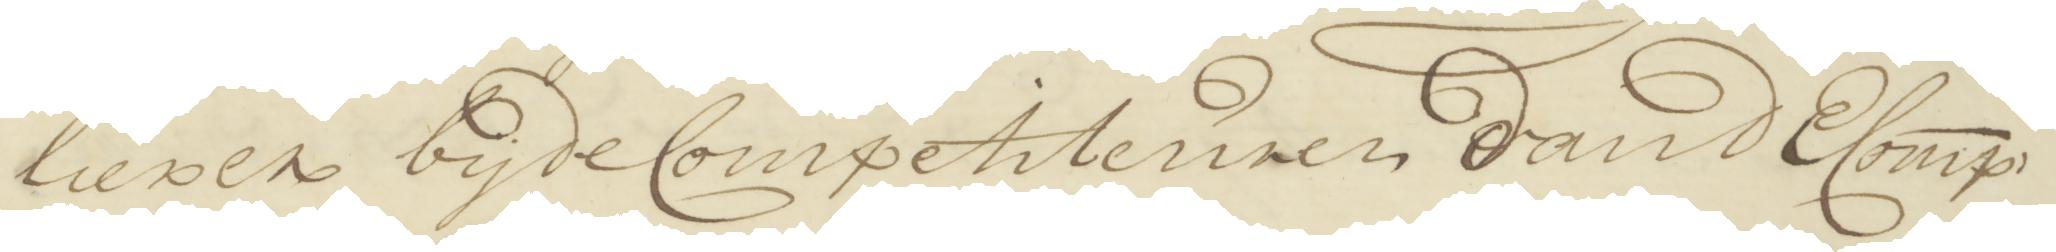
liever bij de Competiteuren dan d EComp:
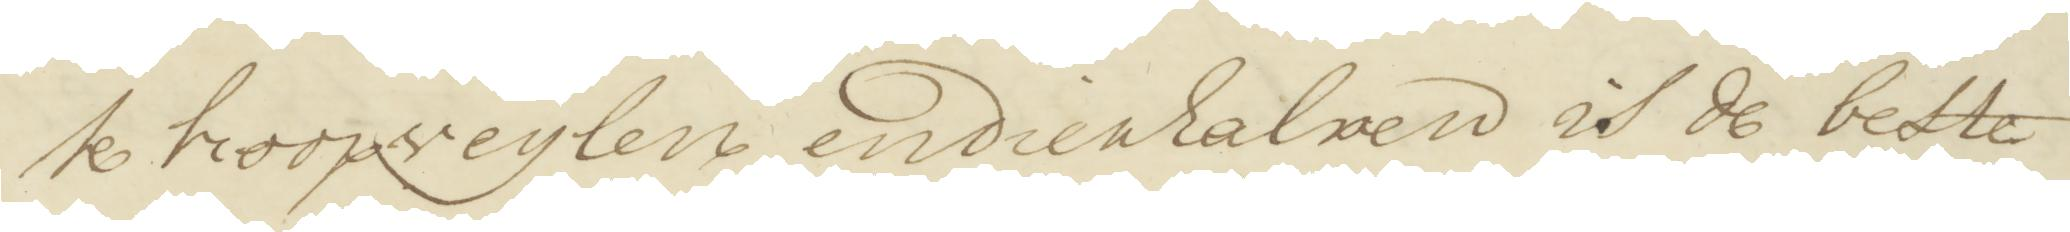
te koop veijlen endierhalven is de beste
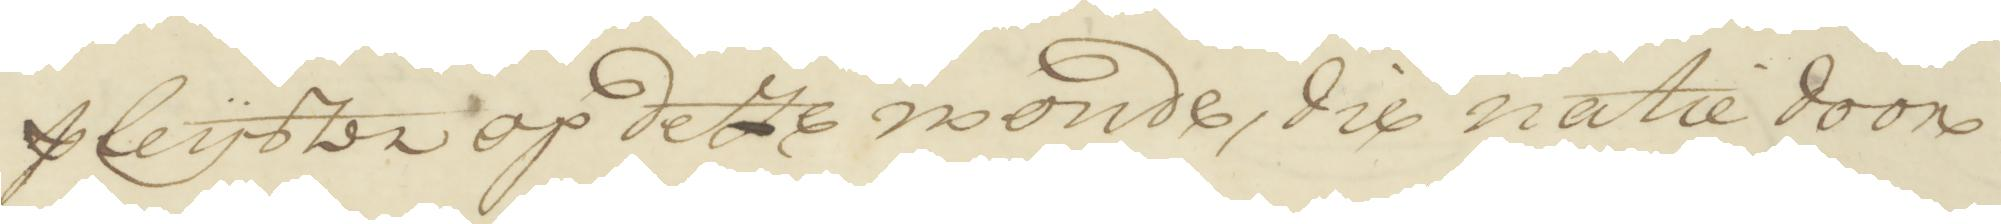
pleijster op deze wonde, die natie door
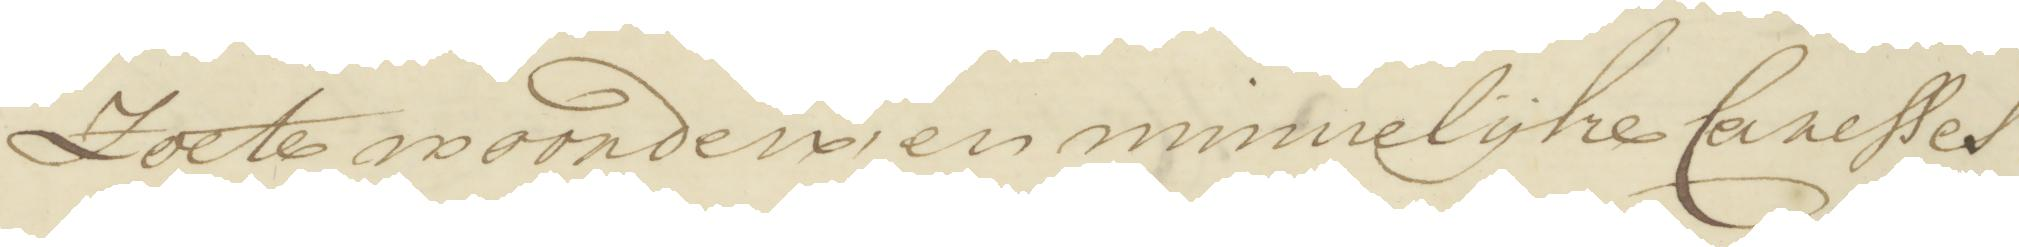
zoete woorden, en minnelijke Caresses
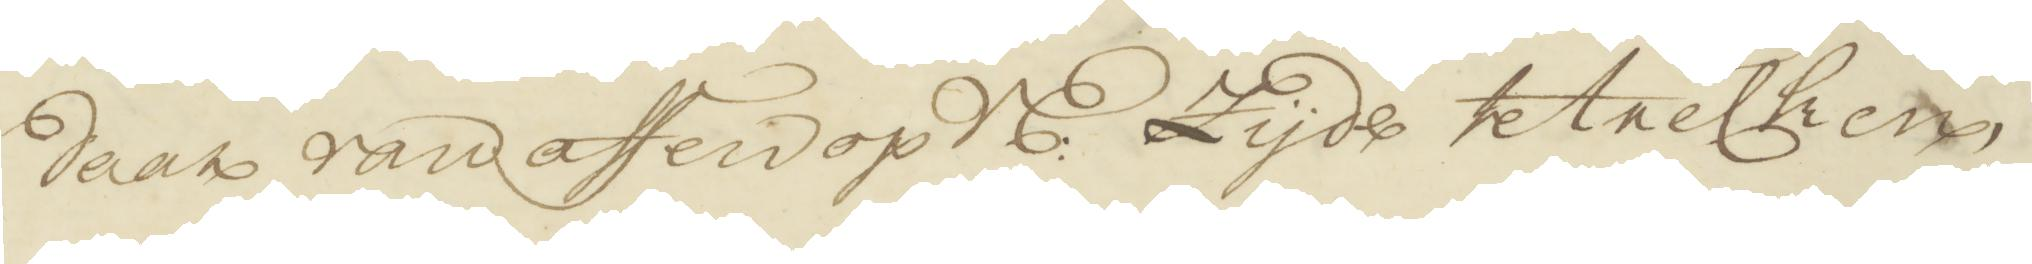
daar van aff en op UE: zijde te trecken,
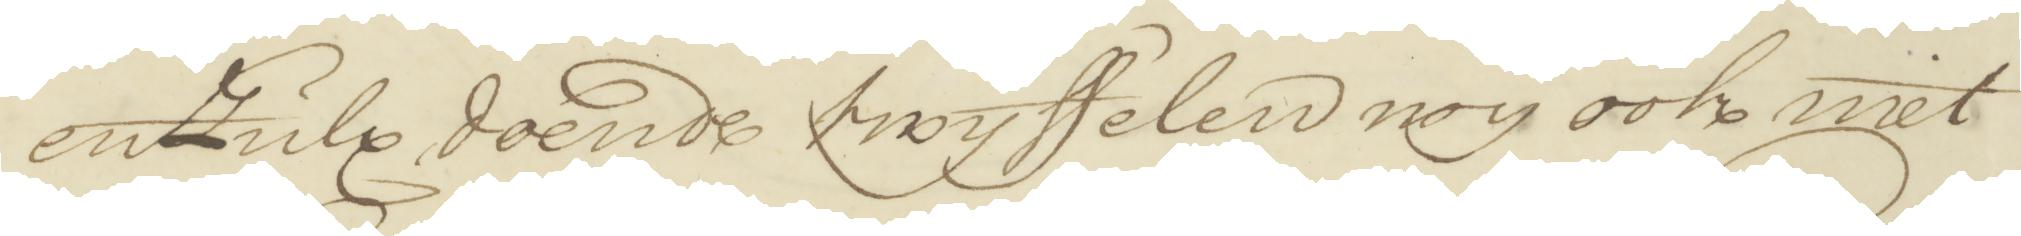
en zulx doende twijffelen wij ook niet
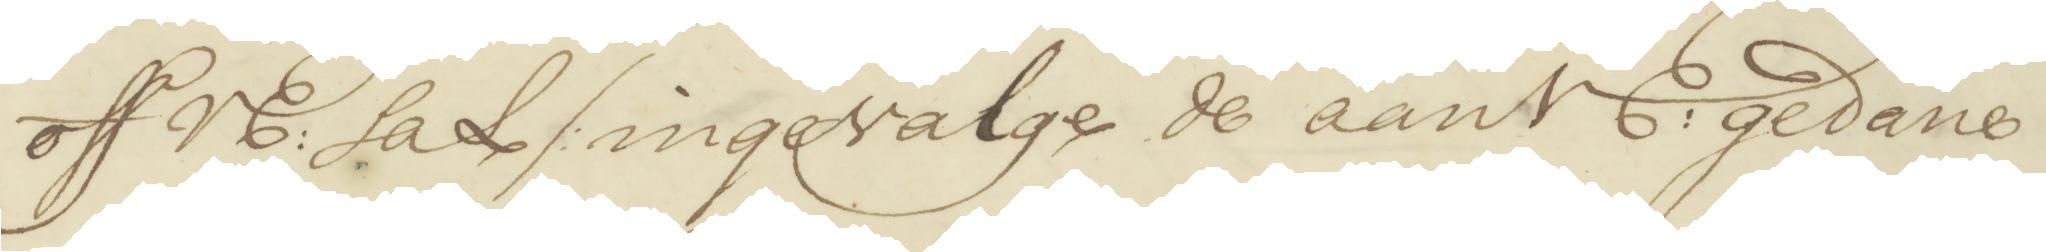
off UE: sal /:ingevalge de aan UE: gedane
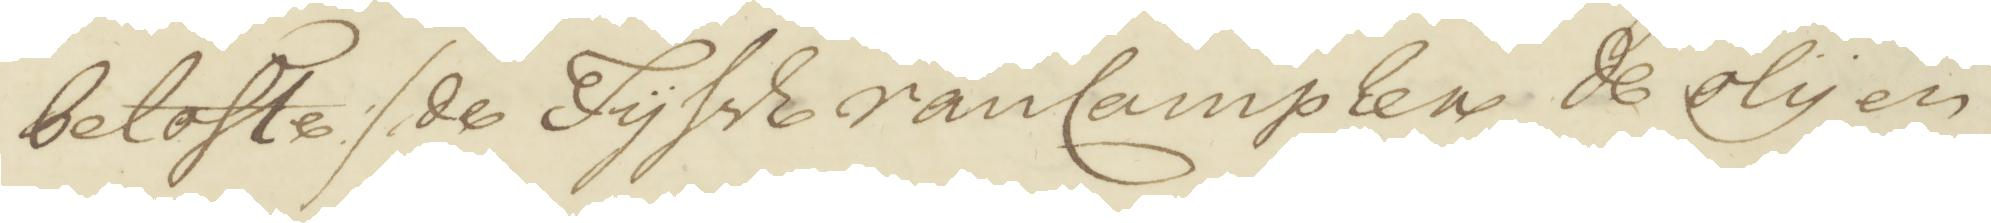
belofte:/ de Eijsch van Campher de olij en
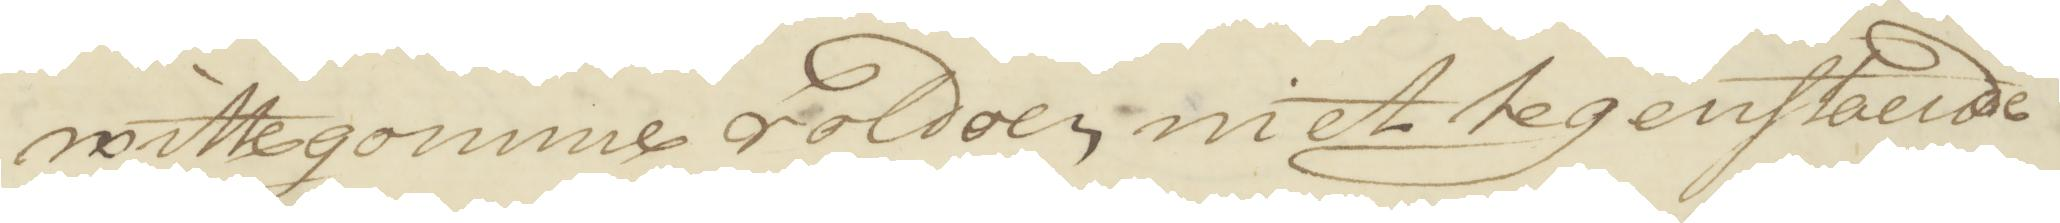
witte gomme voldoen niet tegenstaende
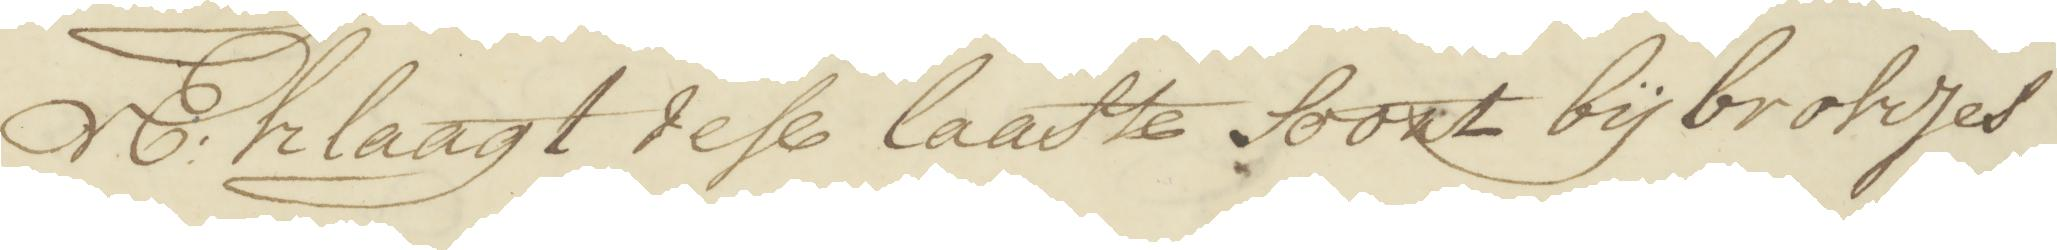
UE: klaagt dese laaste soort bij brokjes
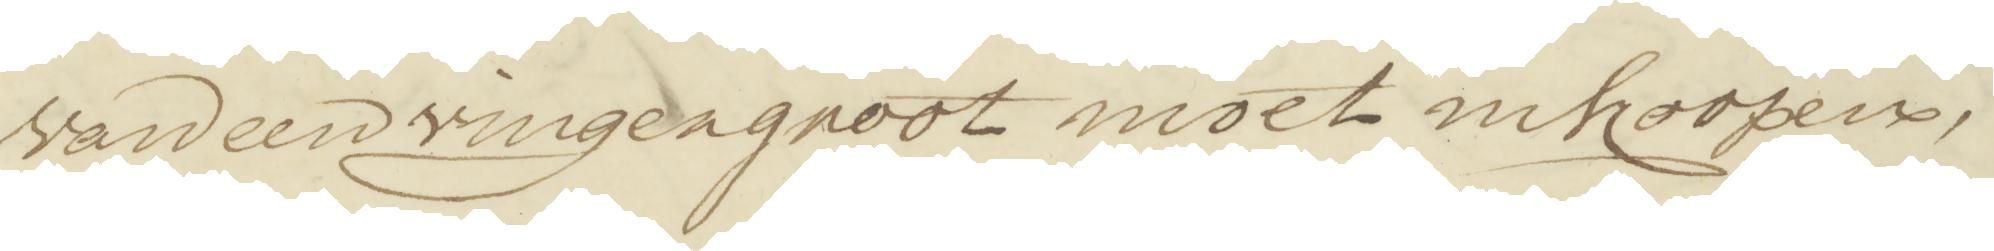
van een vingergroot moet inkoopen,
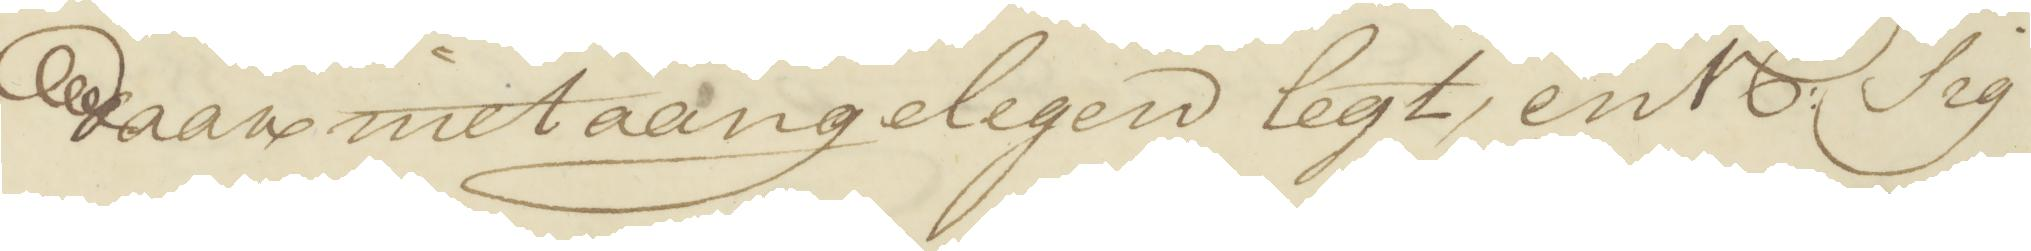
daar niet aangelegen legt, en UE: sig
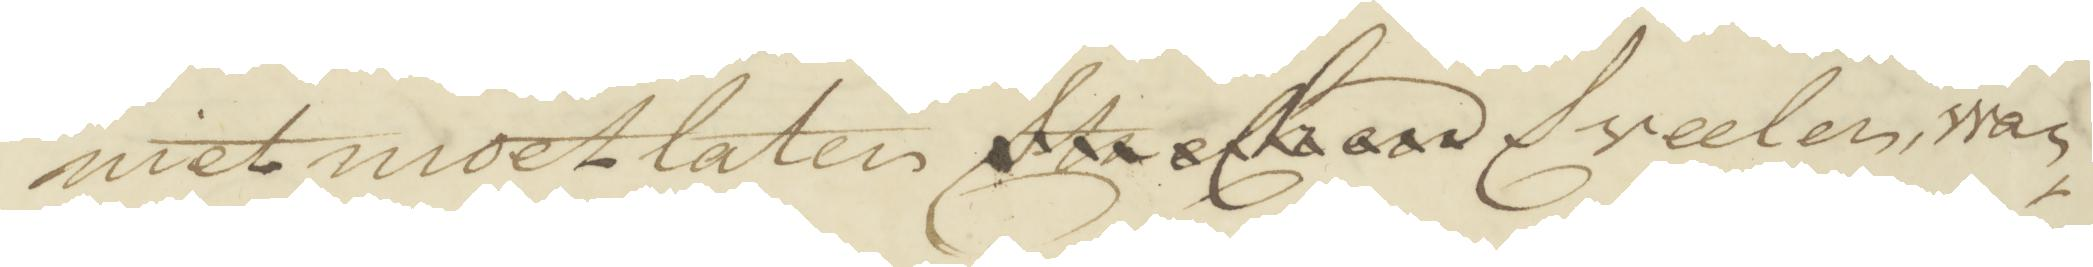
niet moet laten vertrecken verveelen, wan„
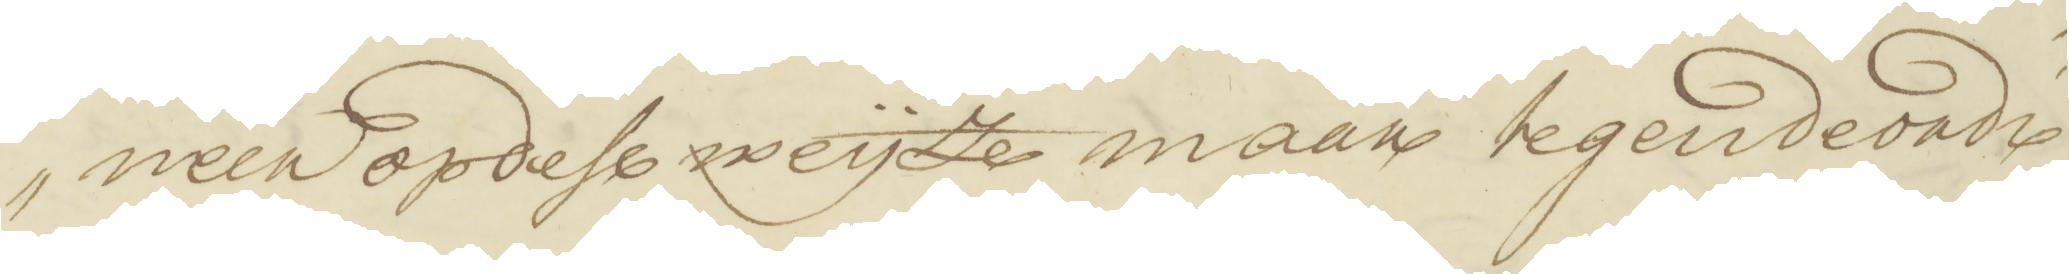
„neer op dese weijze maar tegen de ordie„
